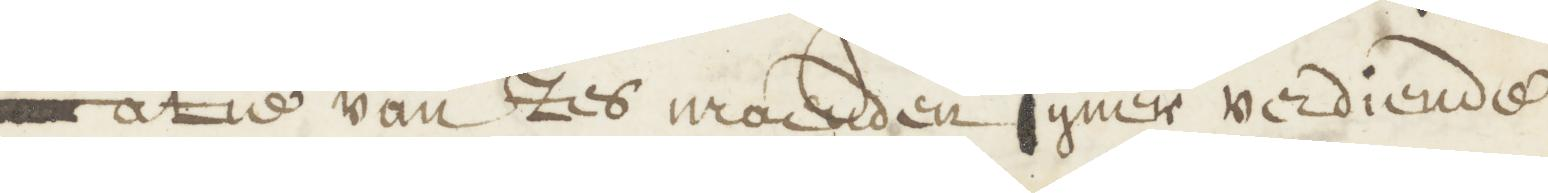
catie van zes maenden sijner verdiende
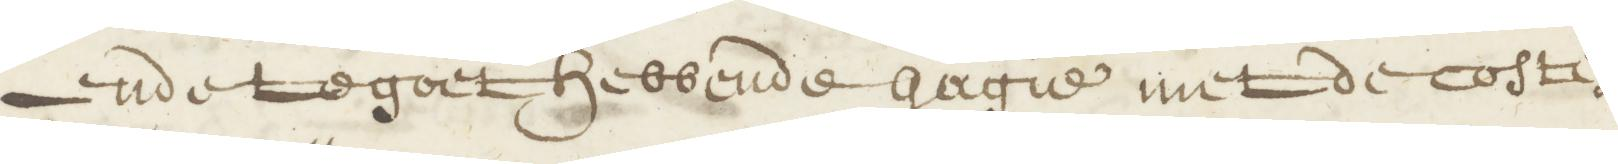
ende tegoet hebbende gagie met de costen
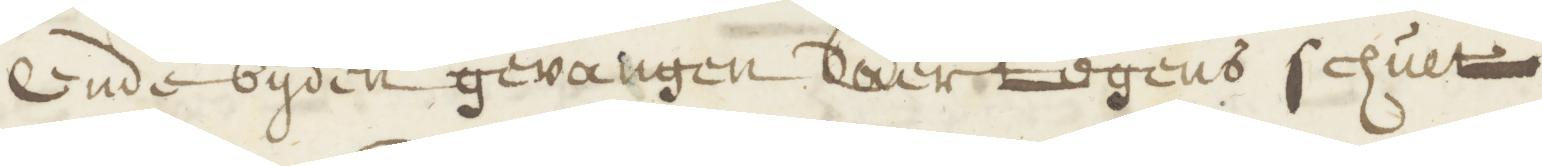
ende bijden gevangen daertegens schult
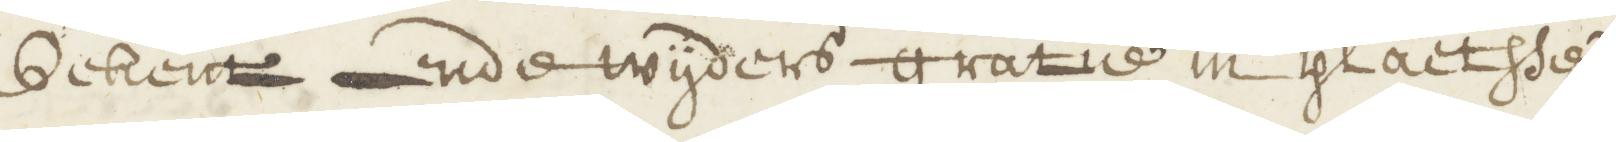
bekent ende wijders gratie in plaetsse
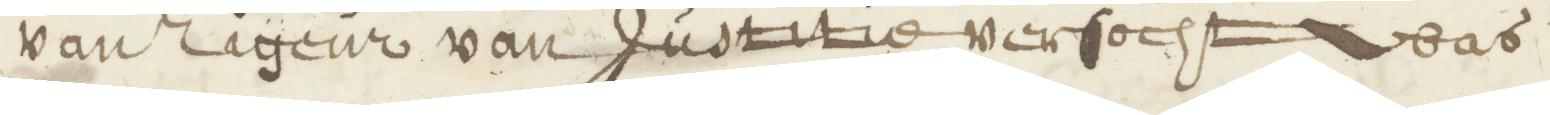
van Rigeur van Justitie versocht was
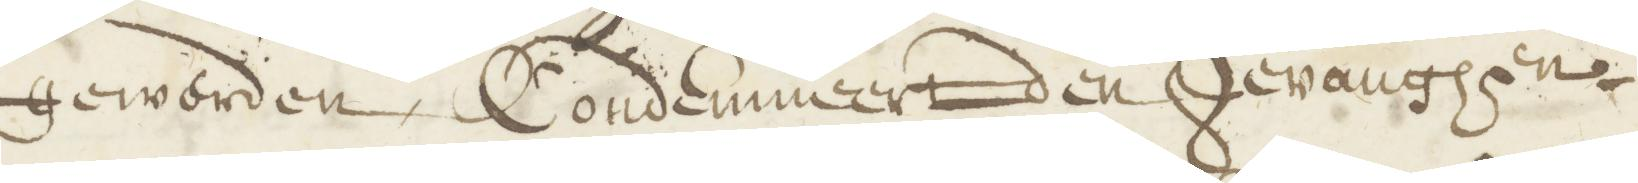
gewerden Condemneert den Gevanghen —
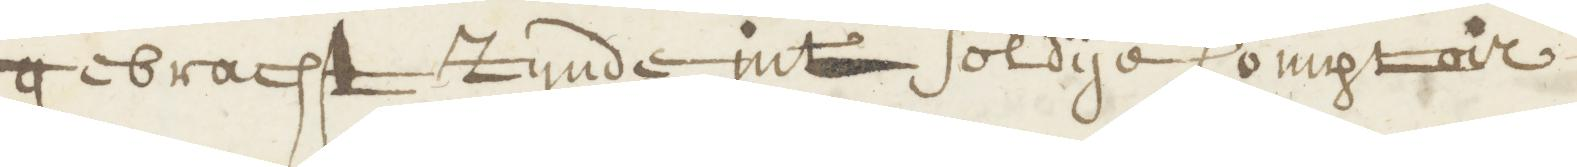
gebracht zynde int soldije Comptoir
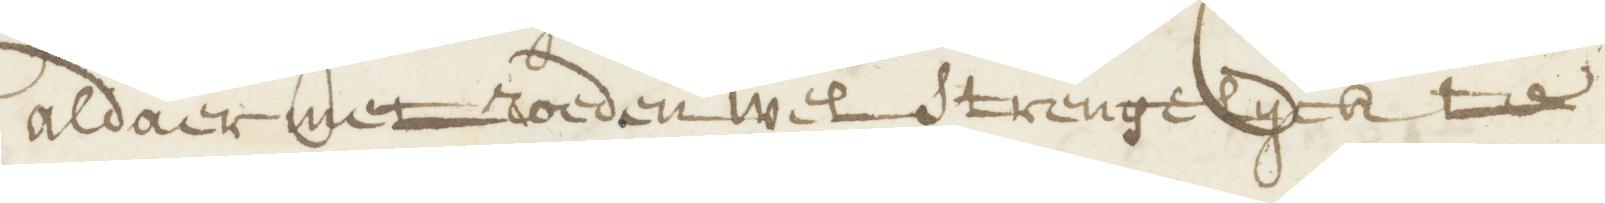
aldaer met roeden wel strengelyck te
